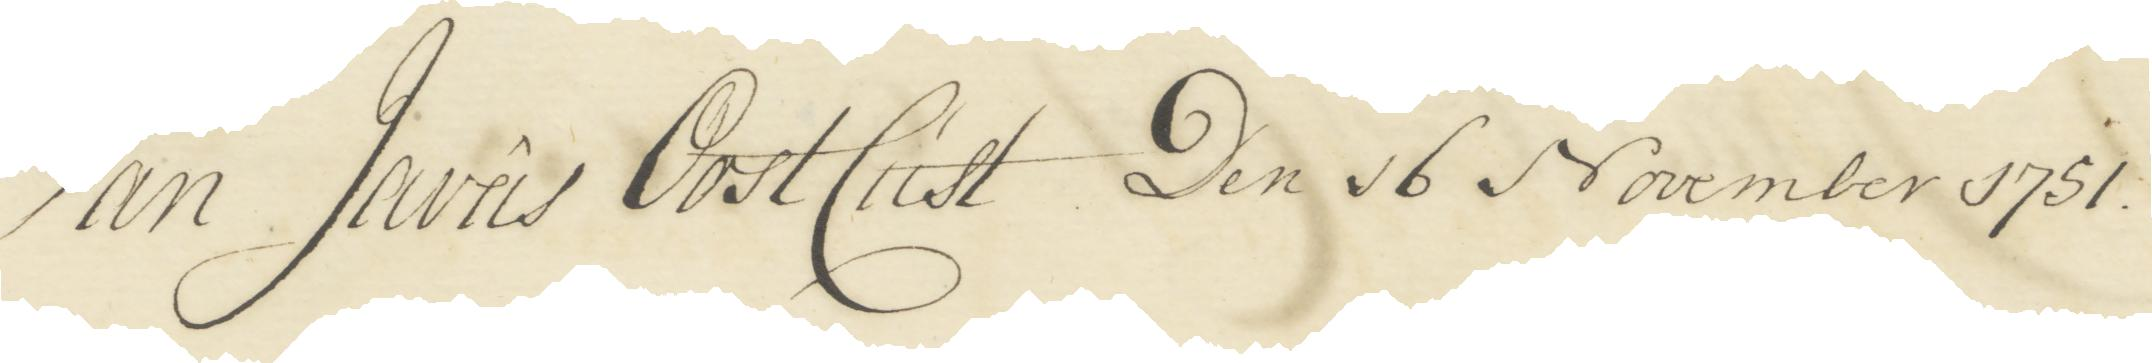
Van Javâs Oost Cust Den 16 November 1751.
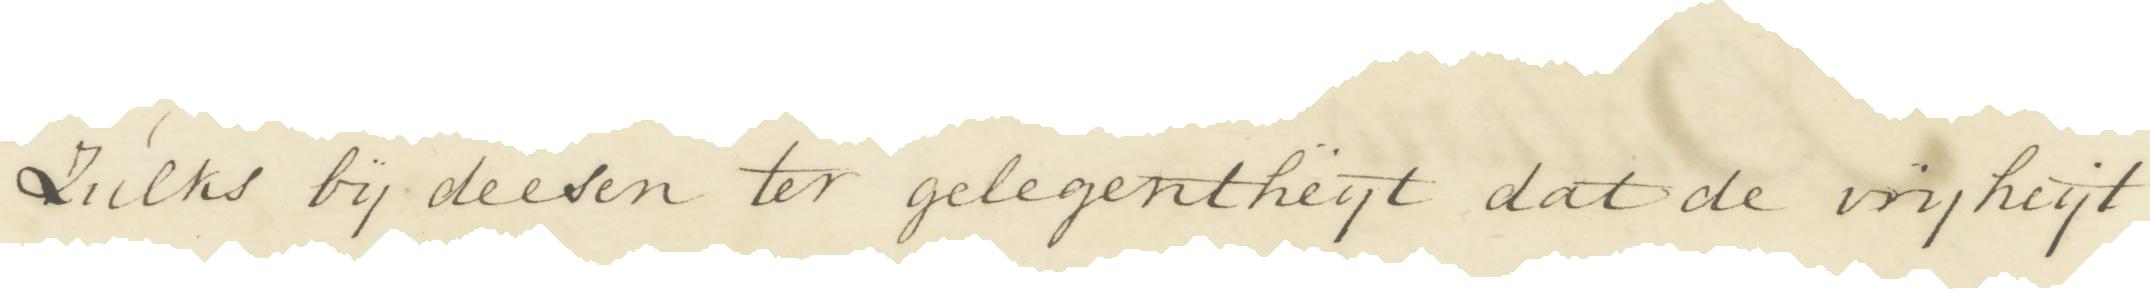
zulks bij deesen ter gelegentheijt dat de vrijheijt
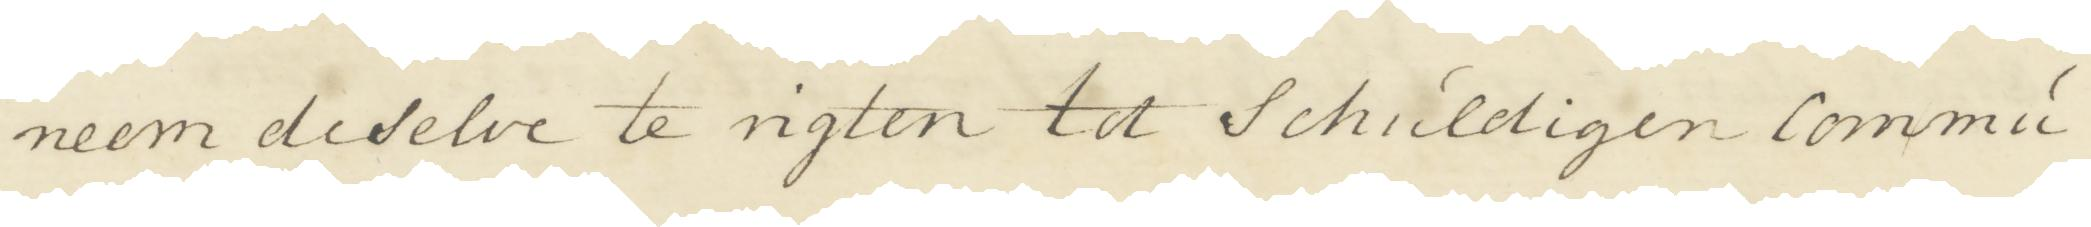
neem deselve te rigten tot schuldigen commu
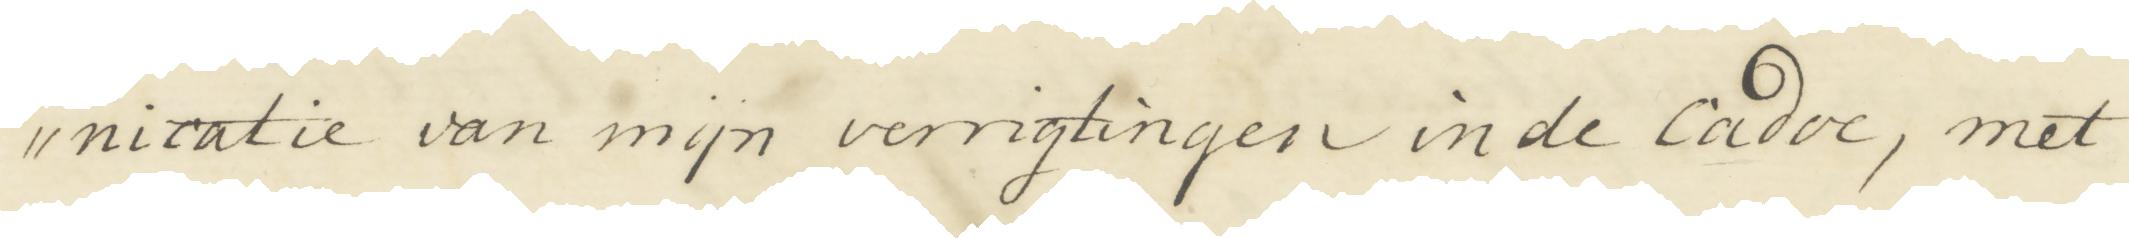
„nicatie van mijn verrigtingen in de cadoe, met
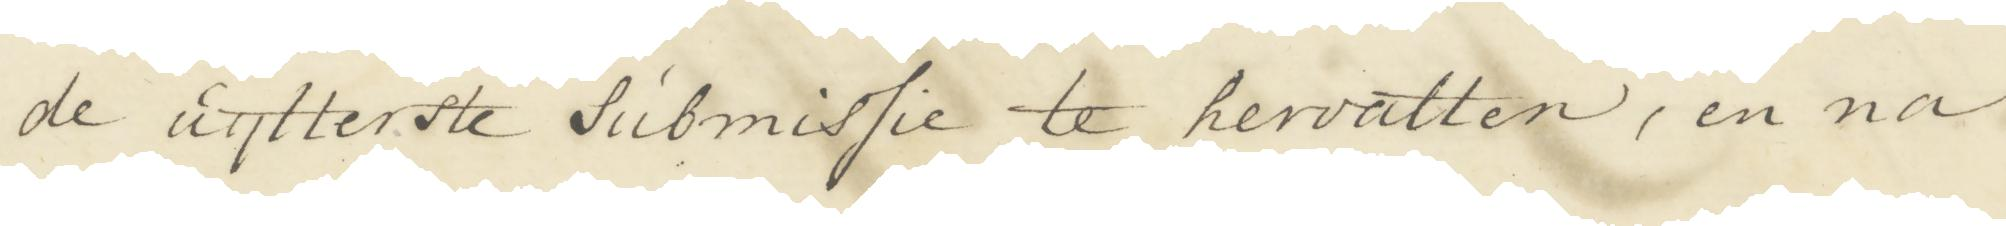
de uytterste submissie te hervatten, en na
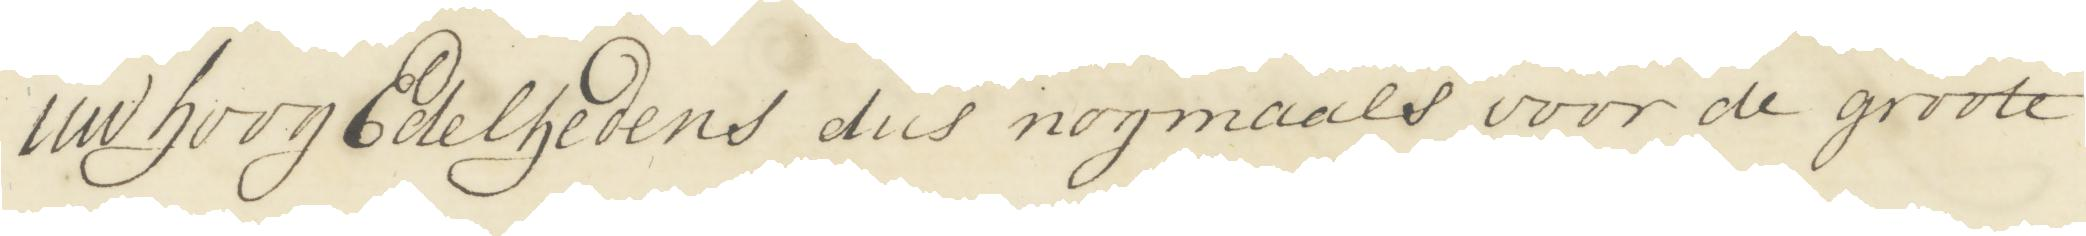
uw Hoog Edelhedens dus nogmaals voor de groote
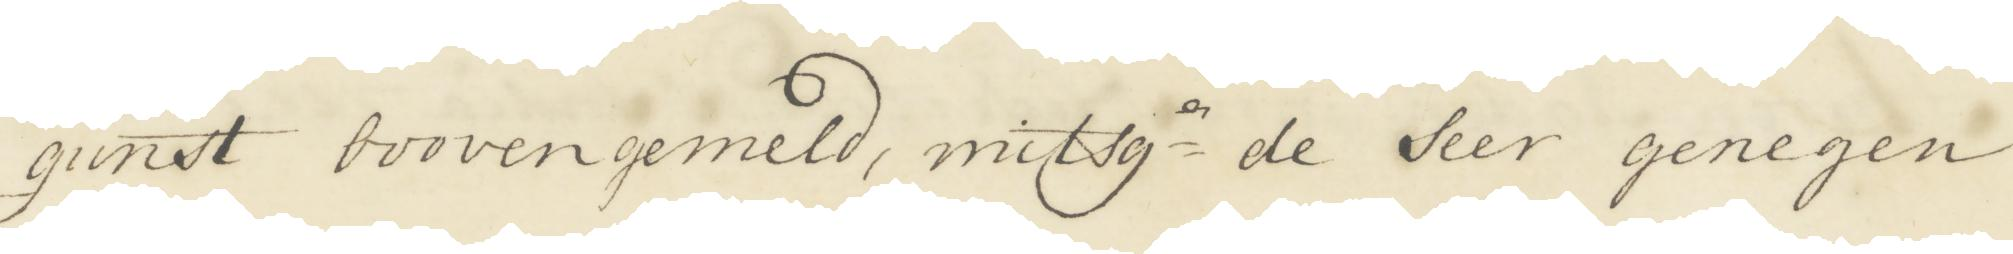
gunst boovengemeld, mitsg=s de seer genegen
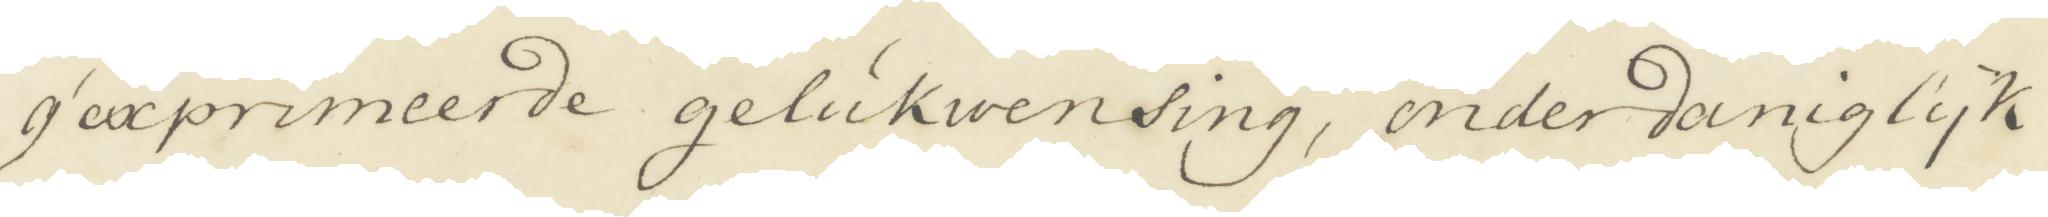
g’exprimeerde gelukwensing, onderdaniglijk
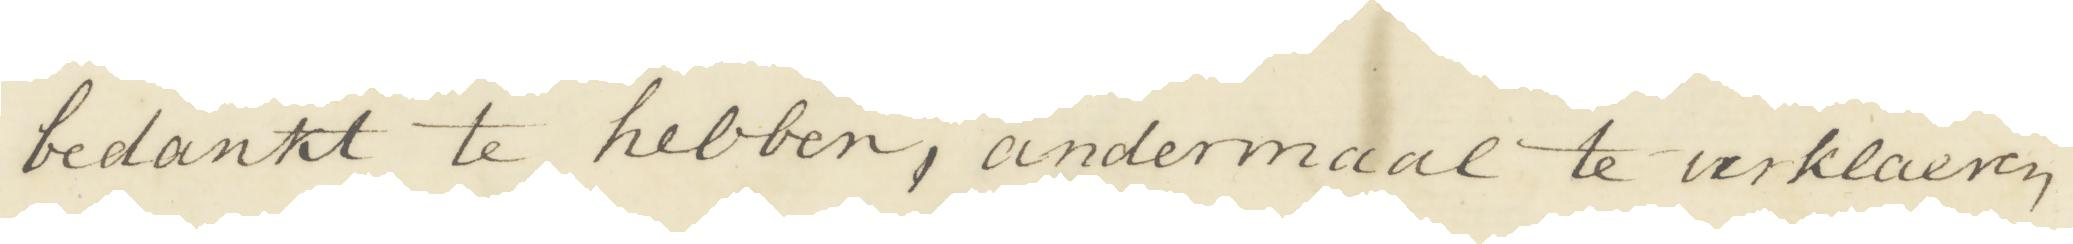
bedankt te hebben, andermaal te verklaeren
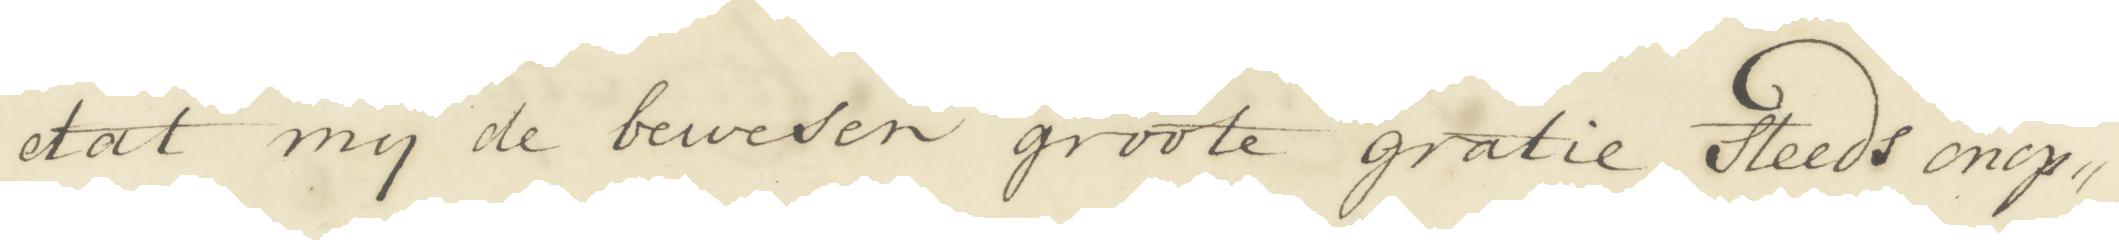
dat mij de bewesen groote gratie, steeds onop„
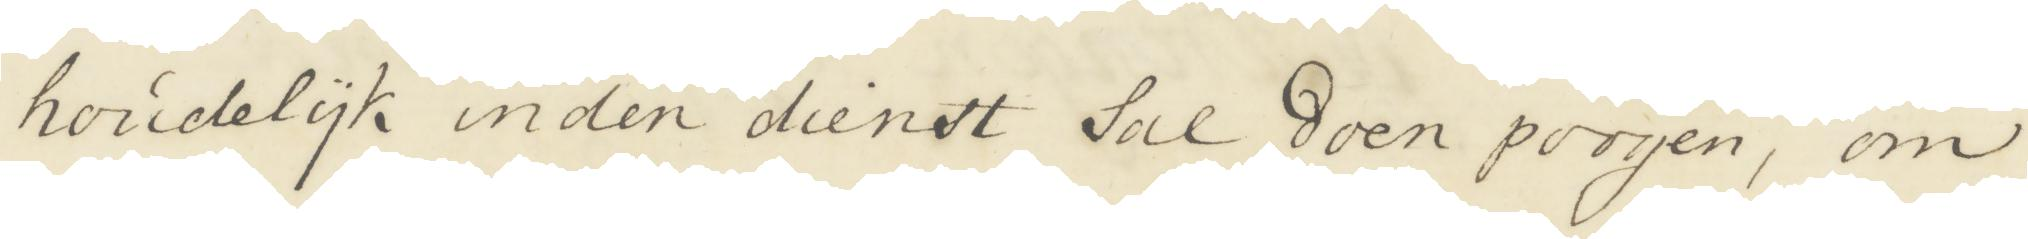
houdelijk in den dienst sal doen poogen, om
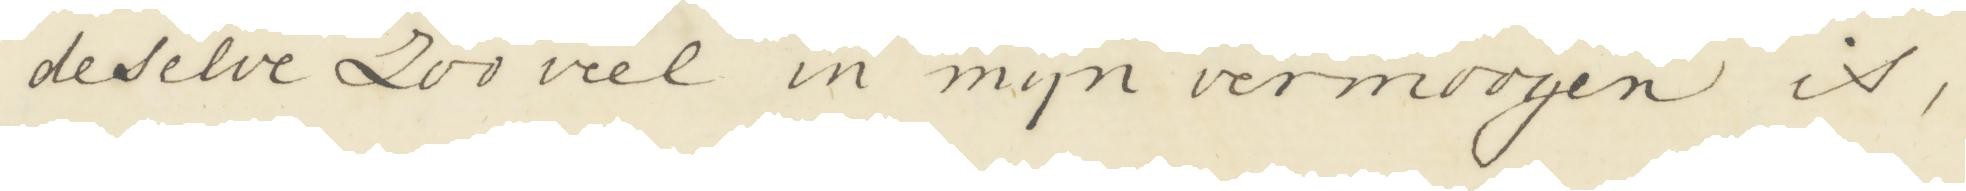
deselve zoo veel in mijn vermoogen is,
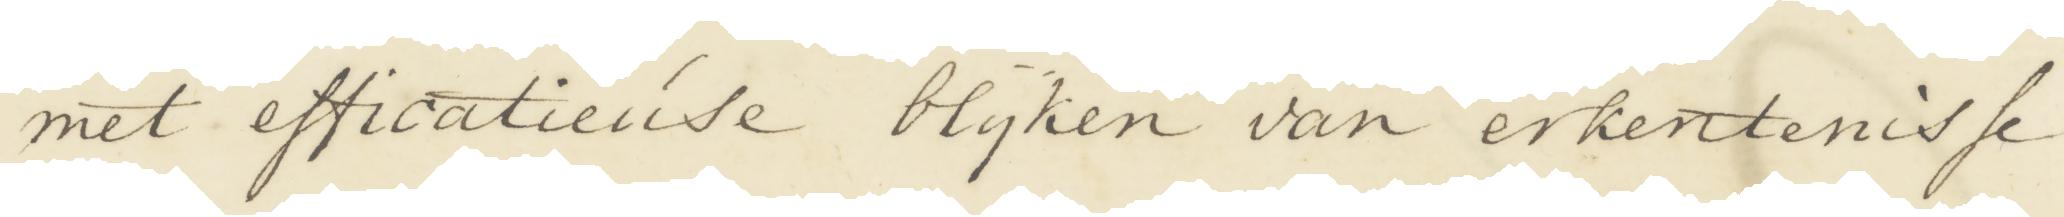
met efficatieuse blijken van erkentenisse
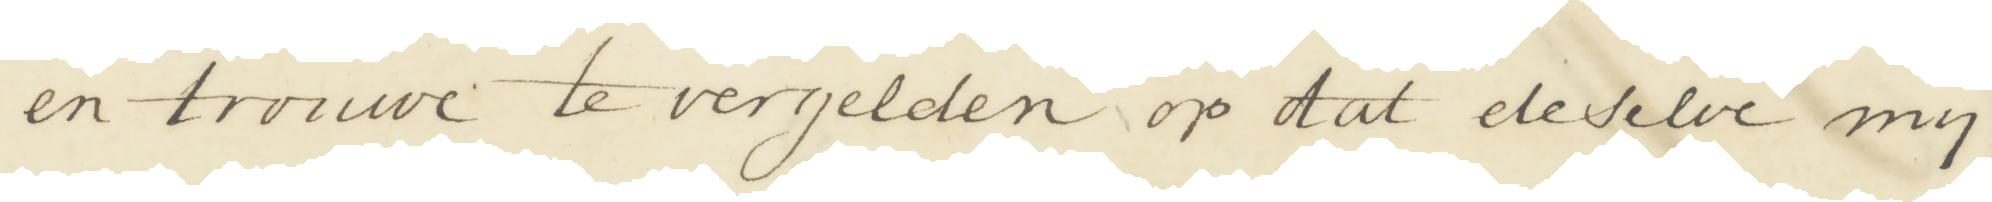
en trouwe te vergelden op dat deselve mij
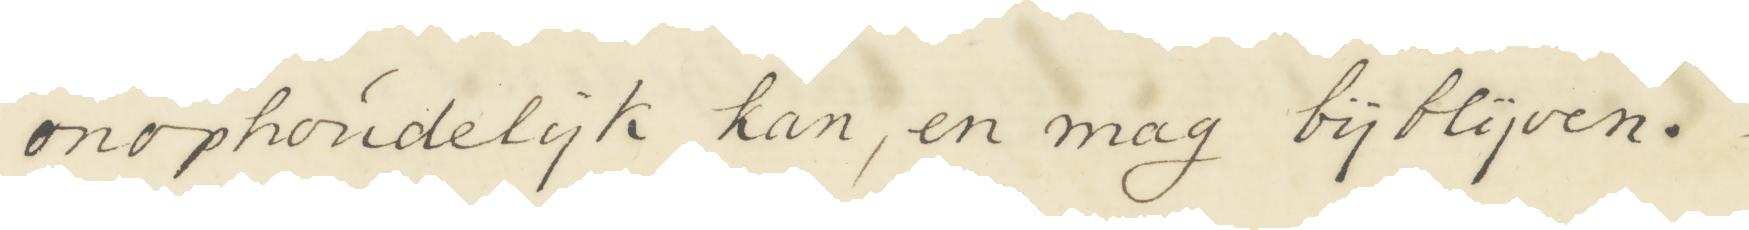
onophoudelijk kan, en mag bij blijven.
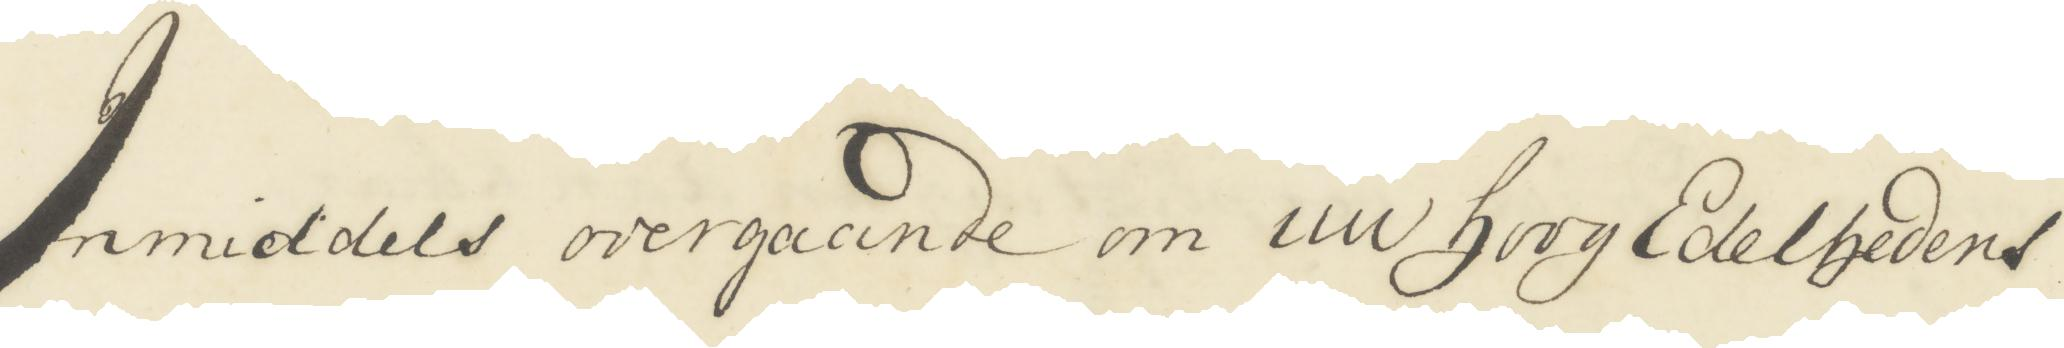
Jnmiddels overgaande om uw Hoog Edelhedens
